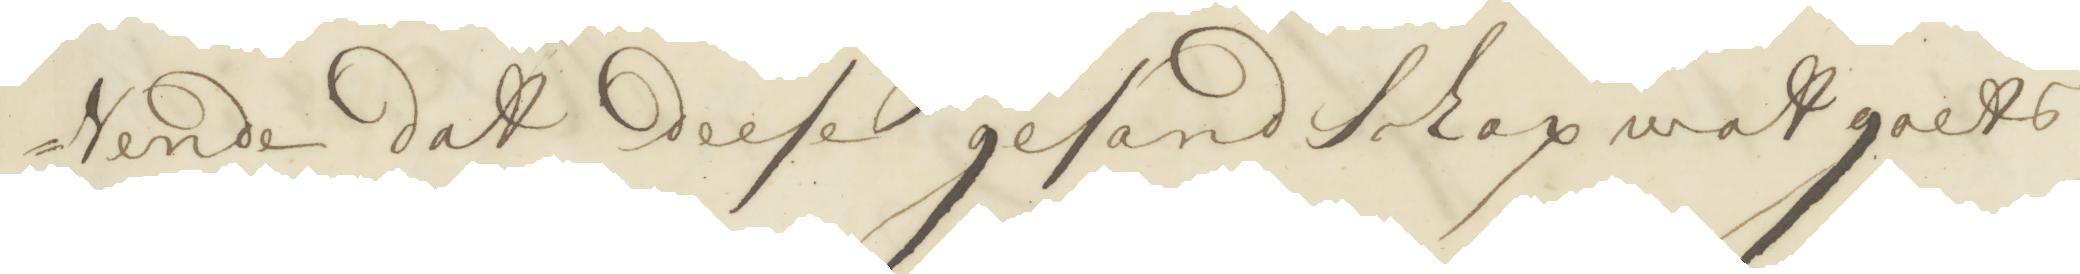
=vende dat deese gesandschap wat goets
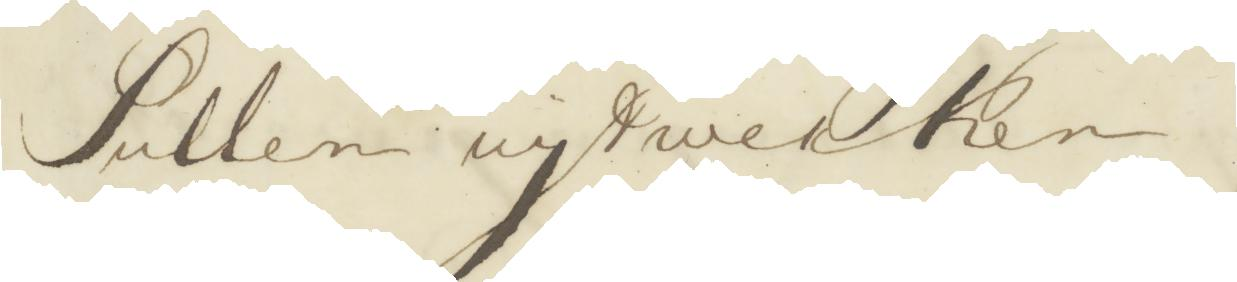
sullen uijtwerken.
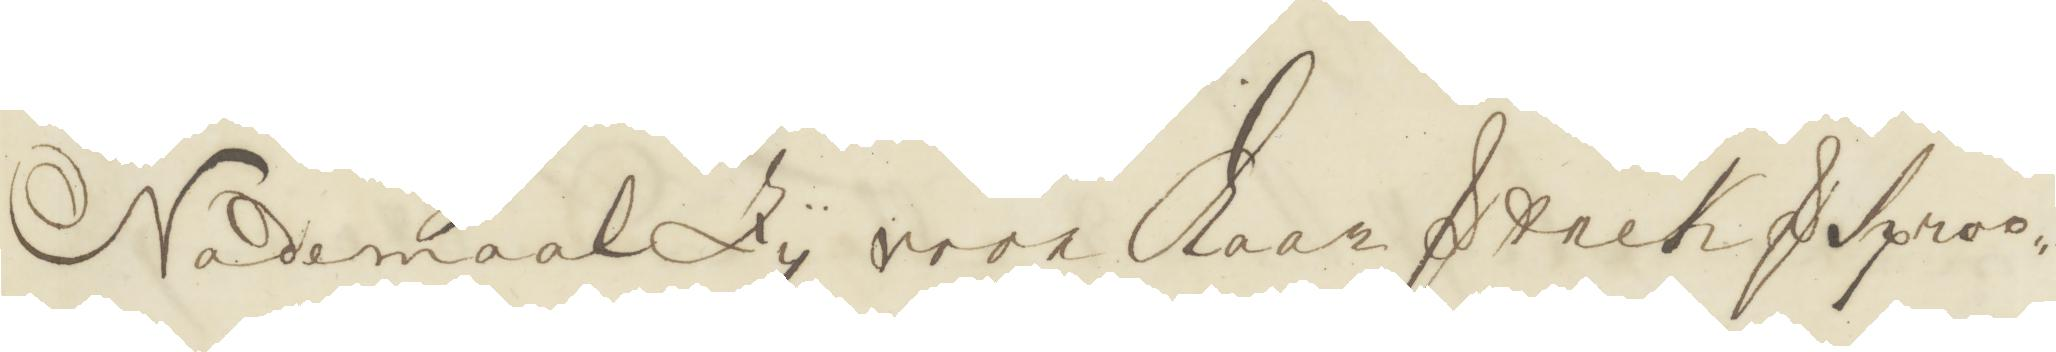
Nademaal zij voor haar vertrek versproo„
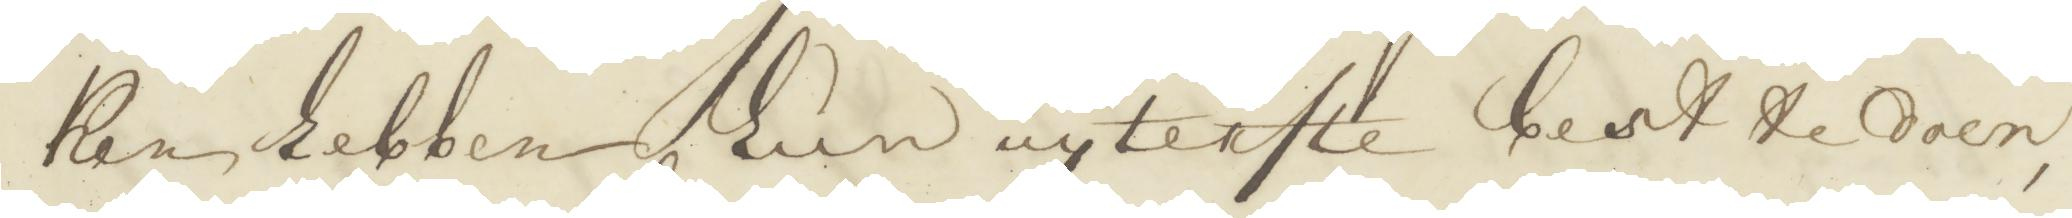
ken hebben hun uijterste best te doen,
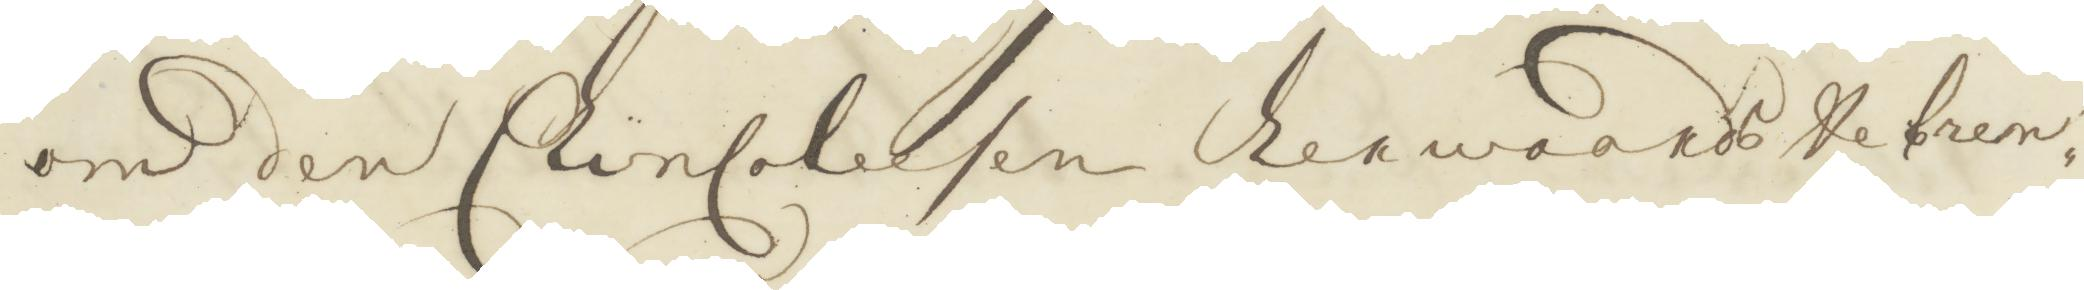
om den Chincoleesen herwaards te bren„
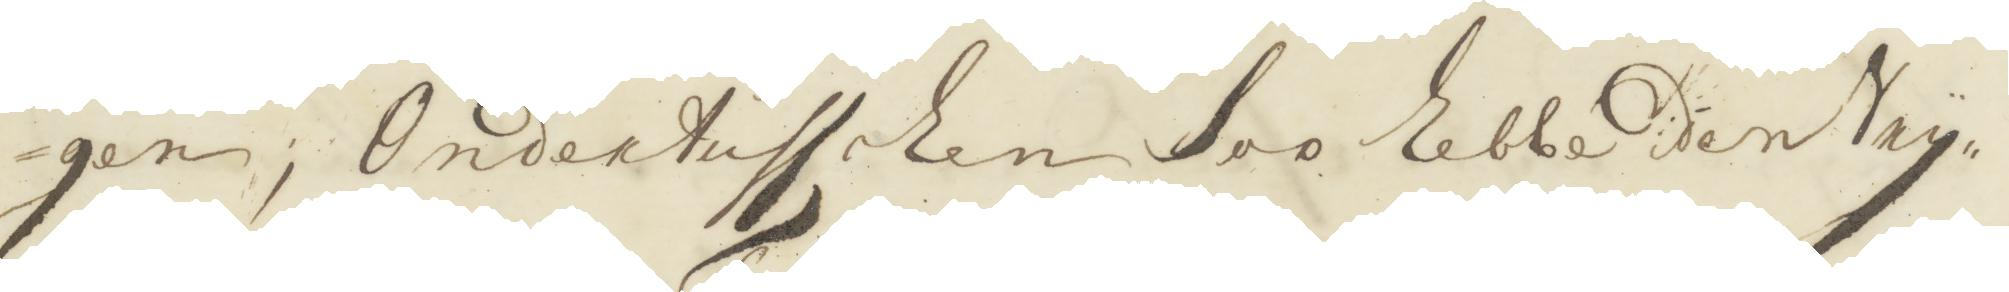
=gen; Ondertusschen soo hebbe den Vrij„
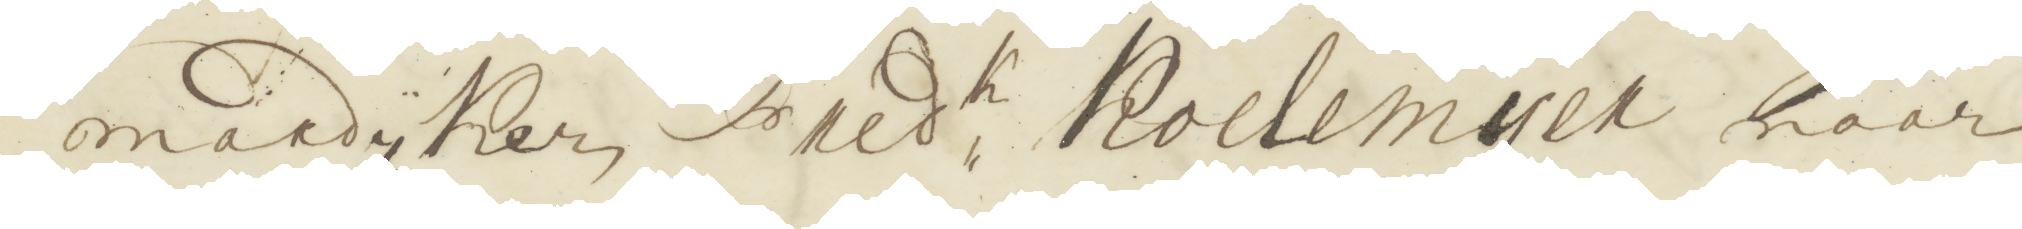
mardijken, Fred„k Koelemijer naar
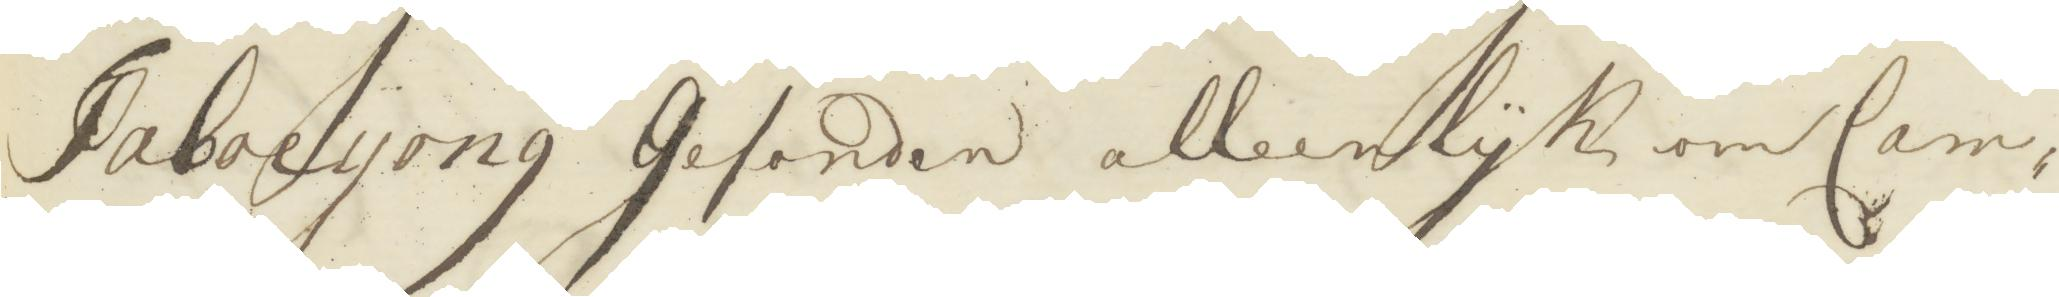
Taboeijong gesonden alleenlijk om Cam„
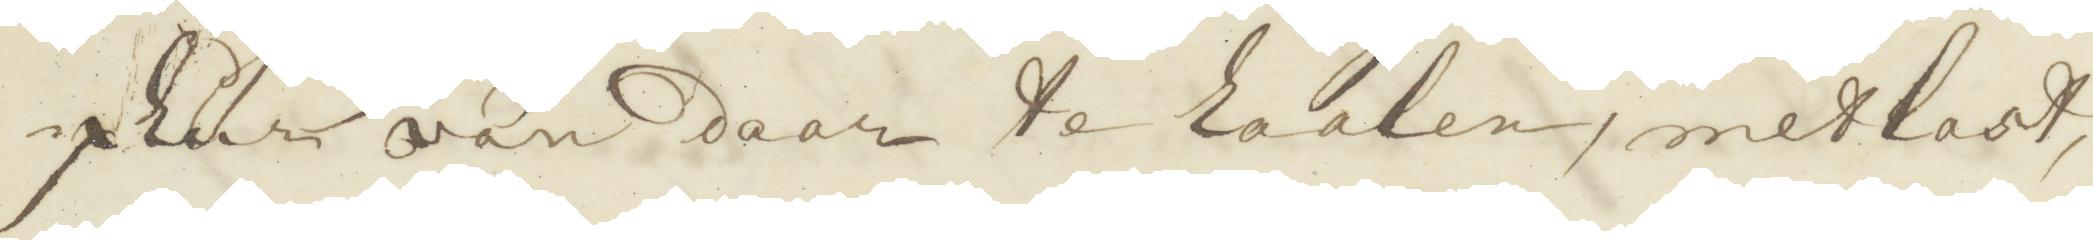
=phur van daar te haalen, met last,
